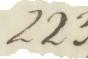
223
